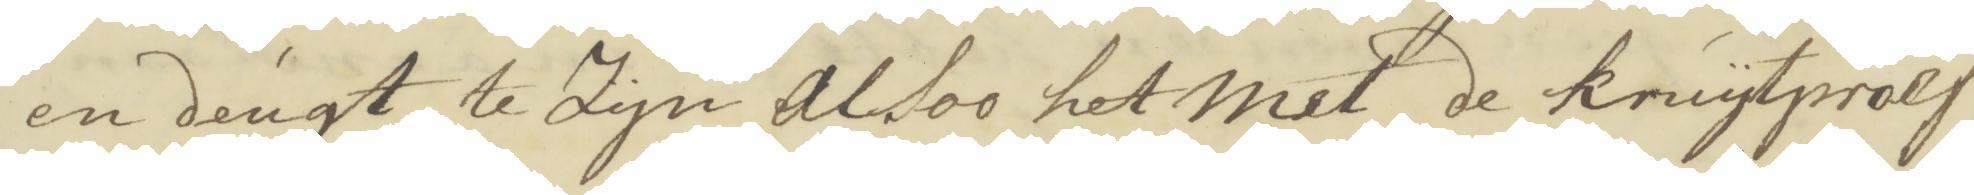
en deugt te zijn Alsoo het met de kruijtproef
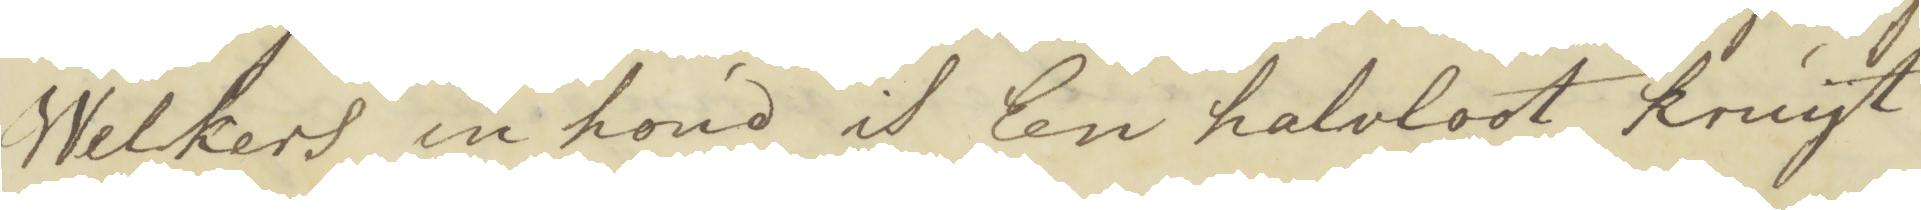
Welkers in houd is Een halvloot kruijt
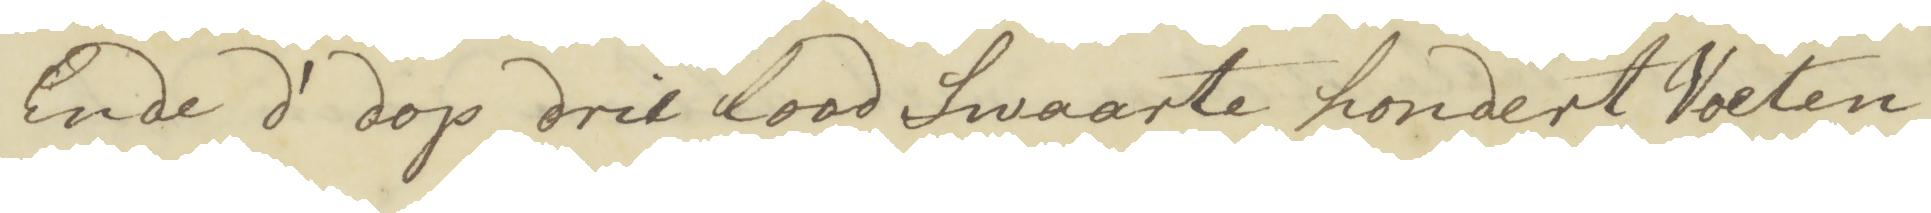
Ende d’ dop drie lood swaarte hondert Voeten
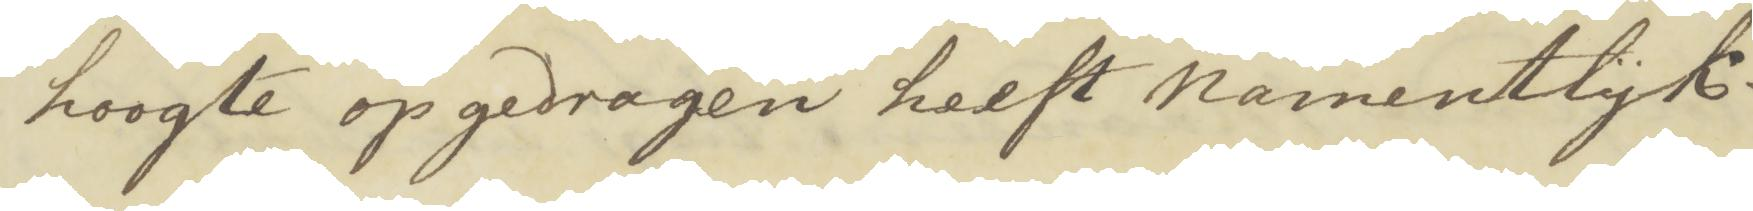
hoogte op gedragen heeft Namentlijk
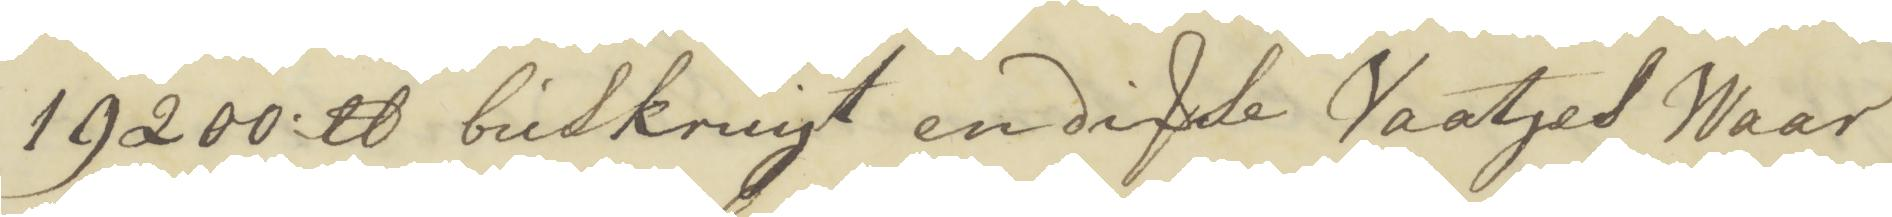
19200: lb buskruijt en diverse Vaatjes Waar
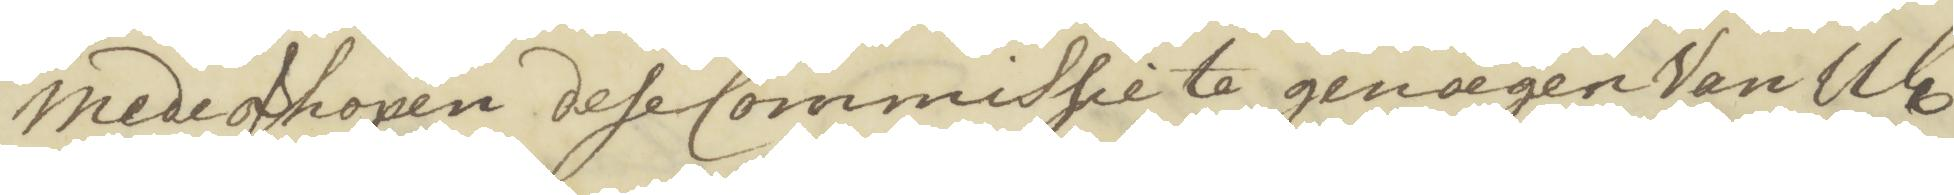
mede verhopen dese Commissie te genoegen Van UE
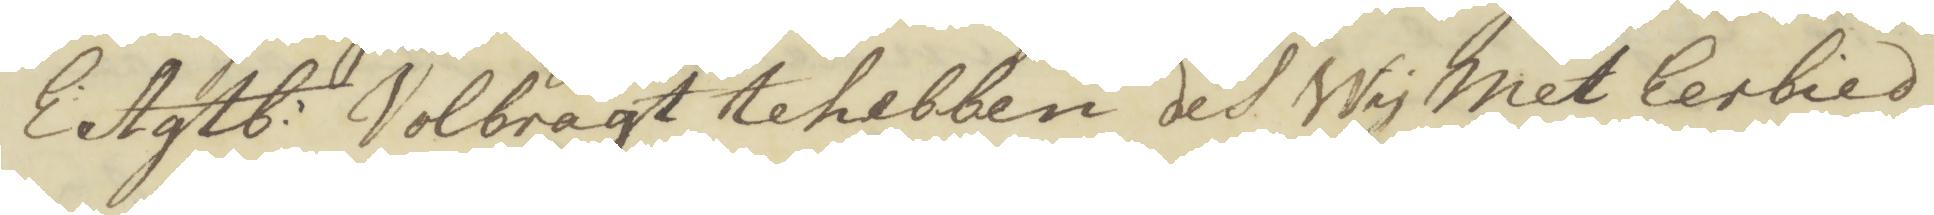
E Agtb: Volbragt tehebben des Wij met Eerbied
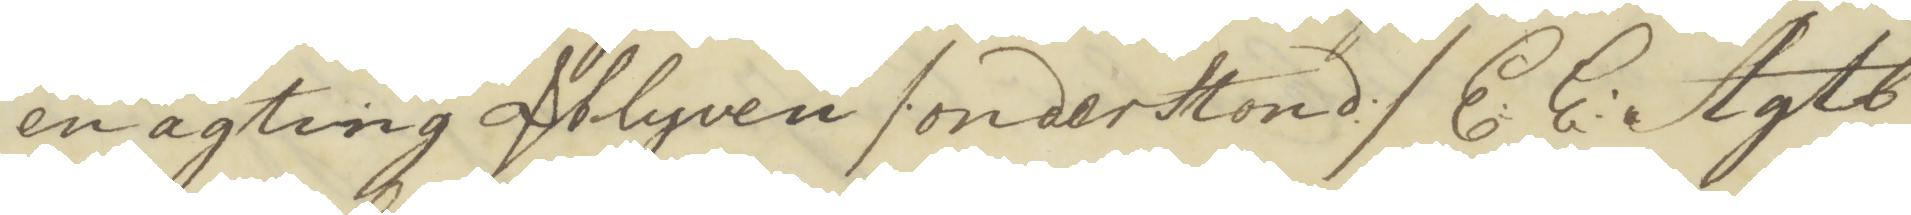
en agting verblyven /:onderstond:/ E: E: Agtb
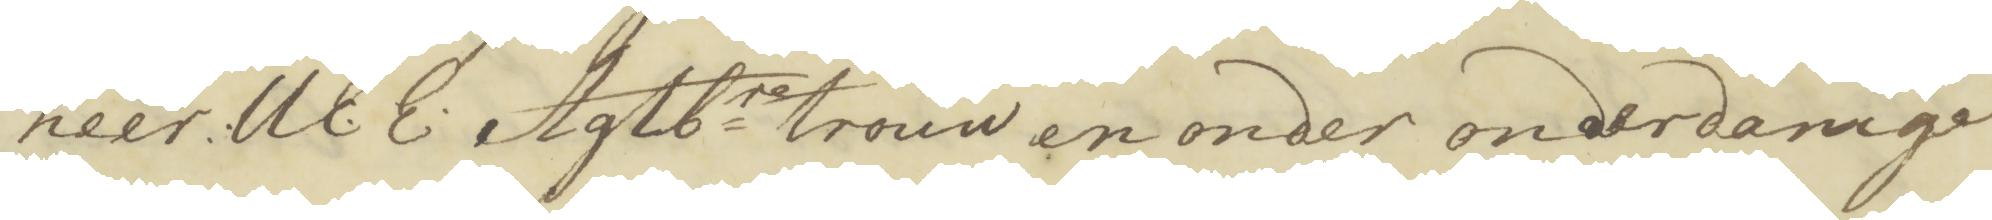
heer: UE. E. Agtb=re trouw en onder onderdanige
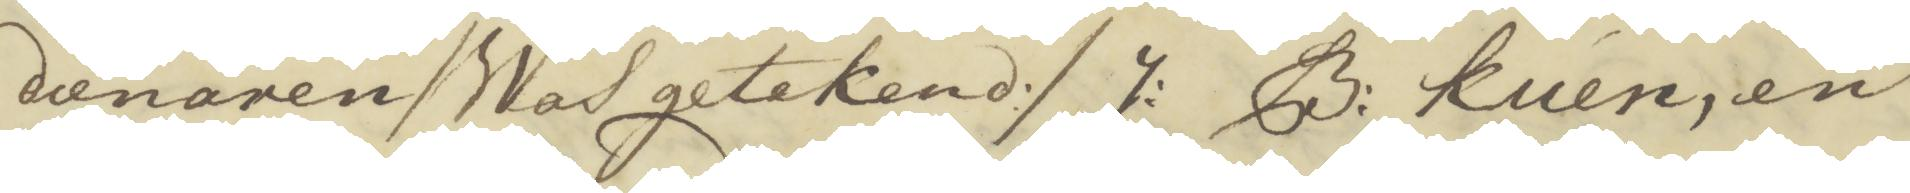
dienaren /Was getekend:/ J: B: kuen, en
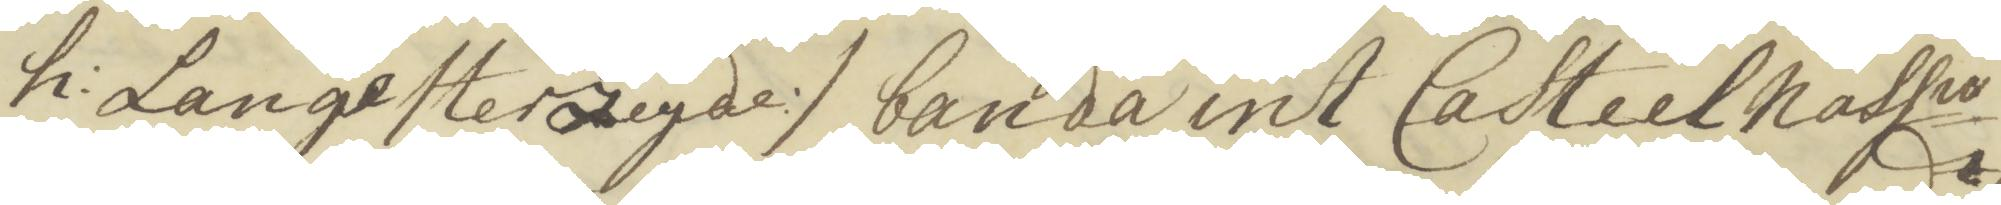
h: Lange /ter zeijde:/ banda int Casteel Nass=w
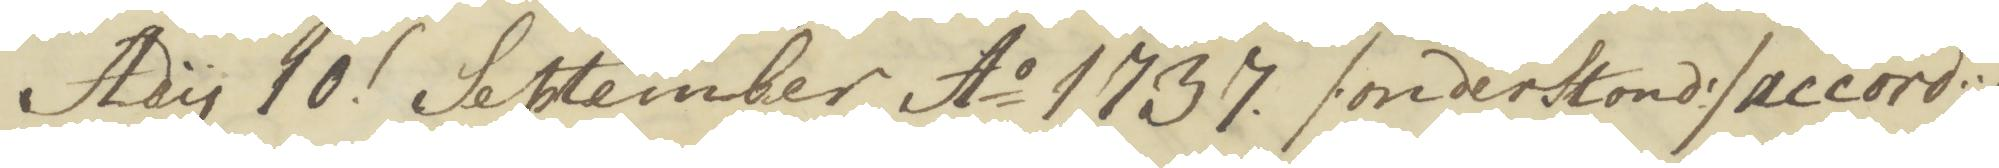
Adij 10.' September A=o 1737. /.onderstond:/ accord:.t/
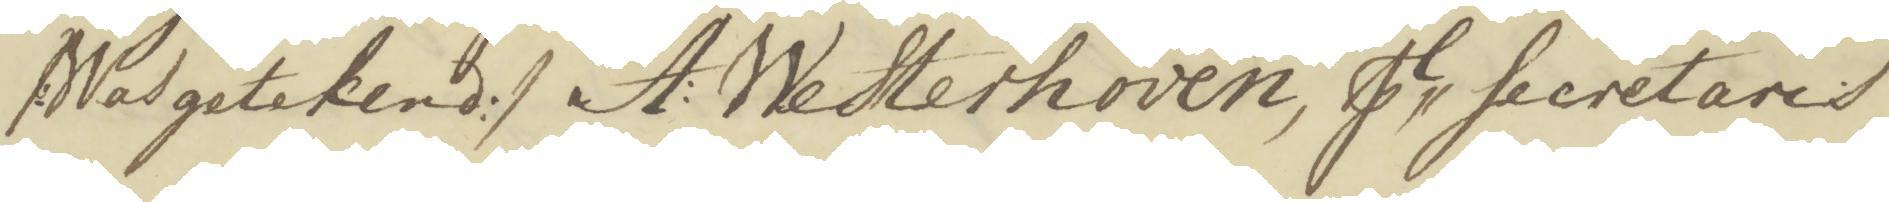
/:Was getekend:/ A: Westerhoven, P„l secretaris
